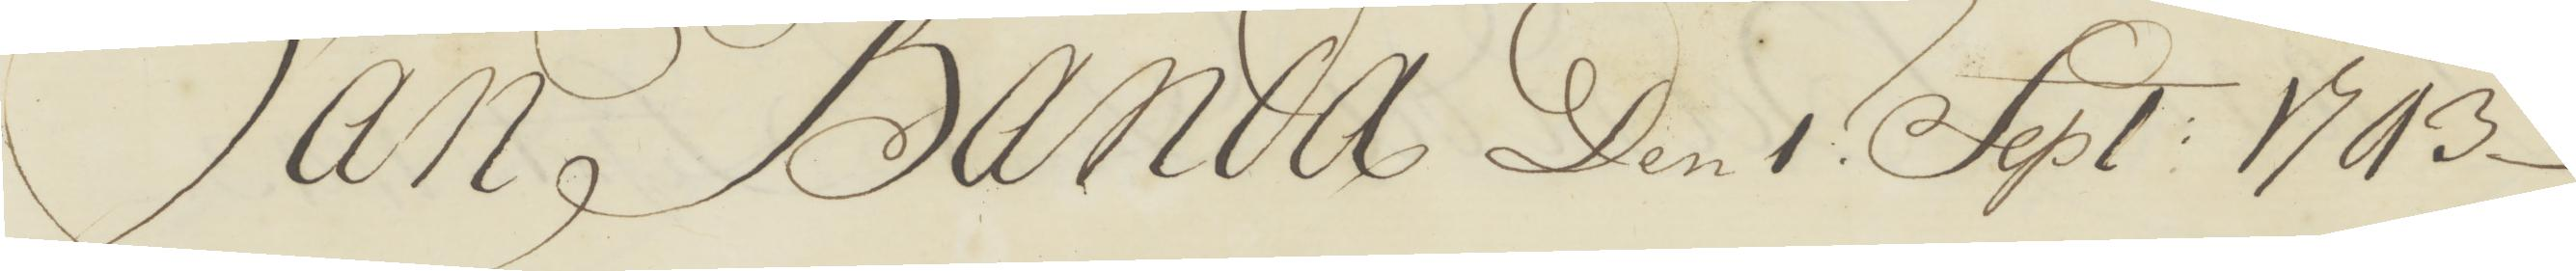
Van Banda Den 1:' Sept: 1743—
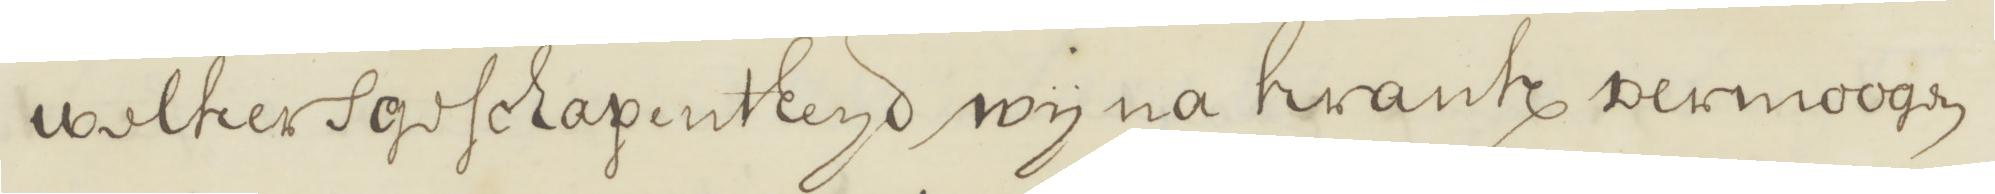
welkers geschapentheijd wij na krank vermoogen
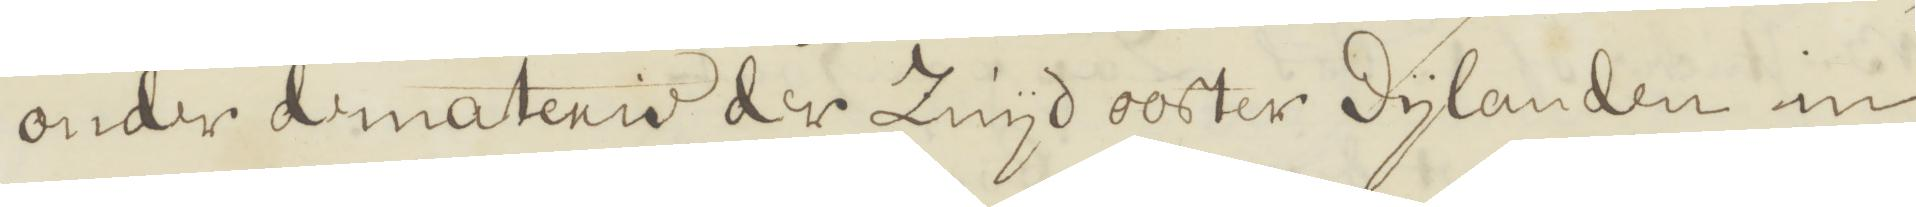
onder dematerie der Zuijd ooster Eijlanden in
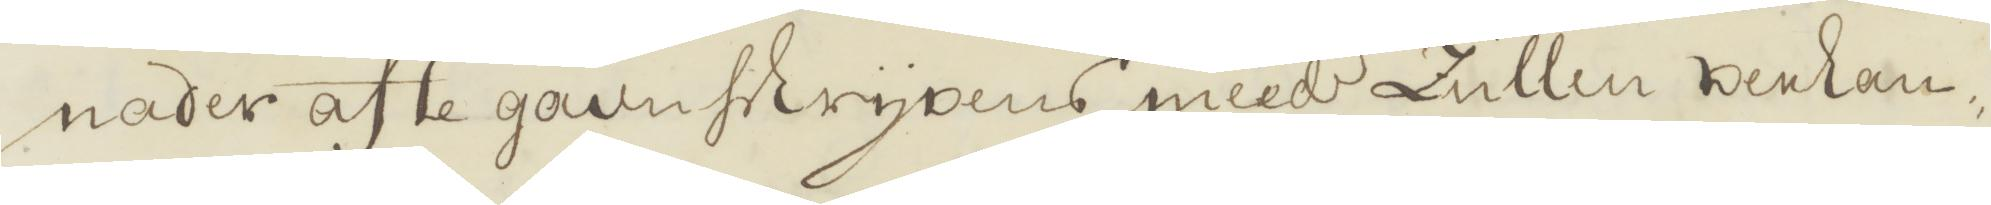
nader afte gaen schrijvens meede zullen verhan„
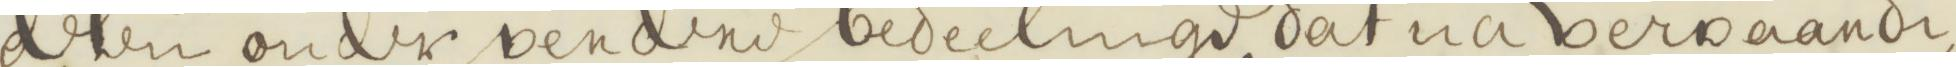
delen onder verdere bedeelinge, dat na vervaardi„
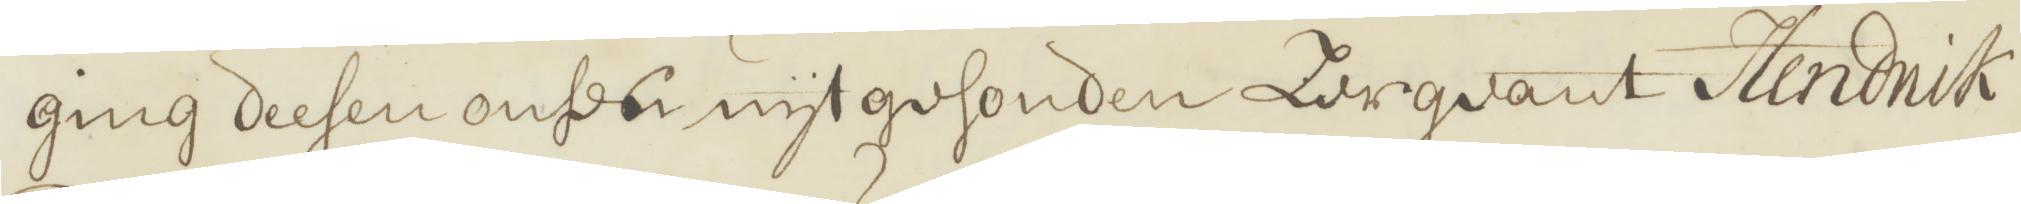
ging deesen onsen uijt gesonden zergeant Hendrik
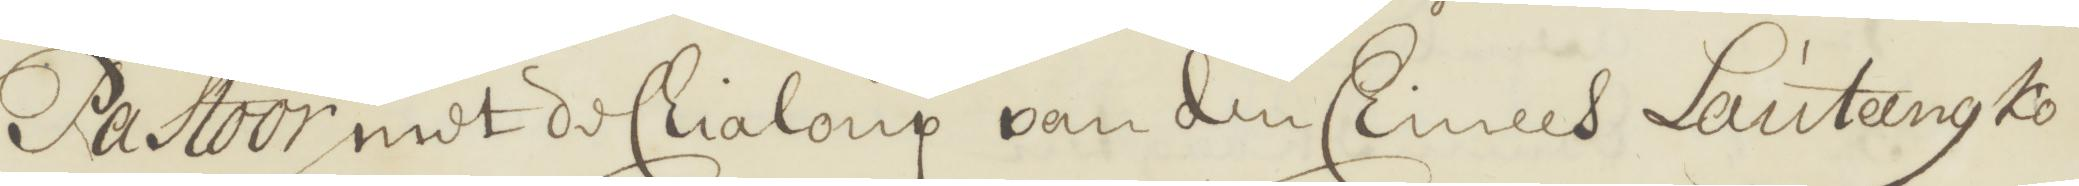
Pastoor met de Chialoup van den Chinees Lauteengko
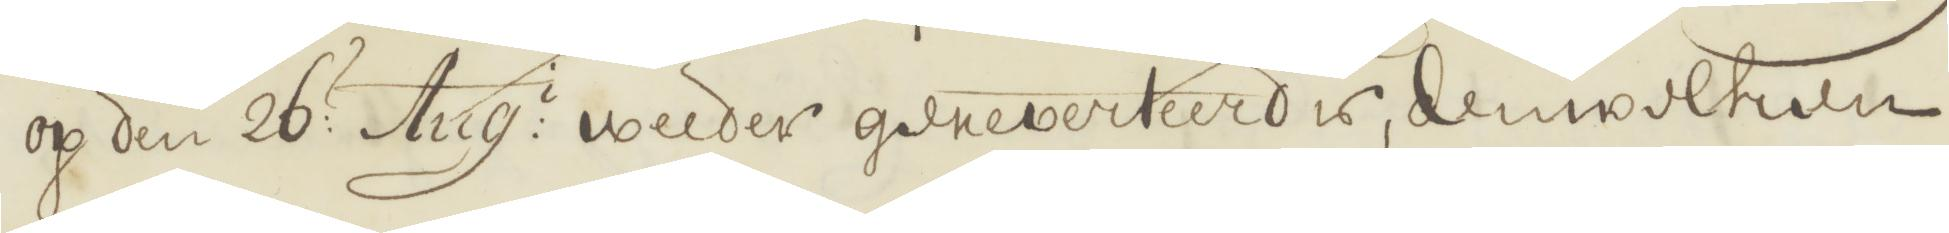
op den 26:' Aug:i weeder gereverteerd is, denwelken
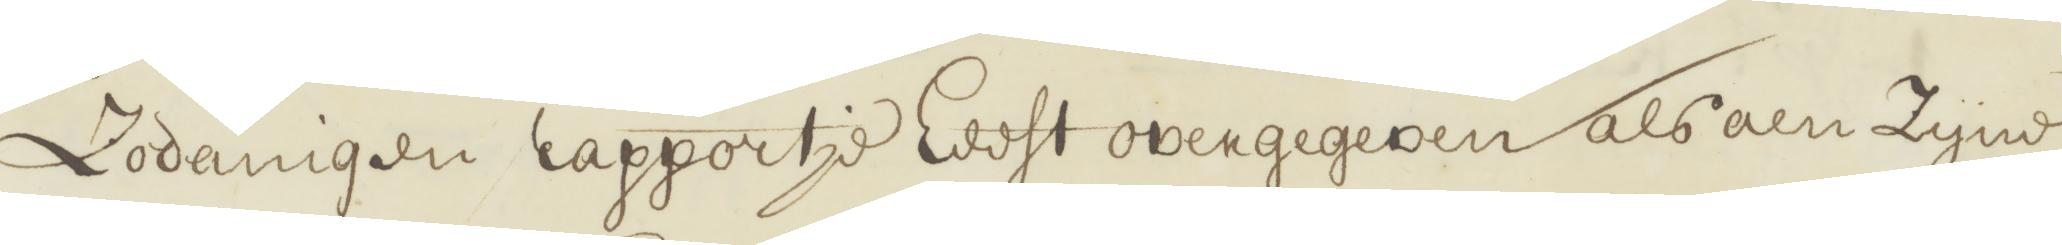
zodanigen rapportje heeft overgegeven als aen zijne
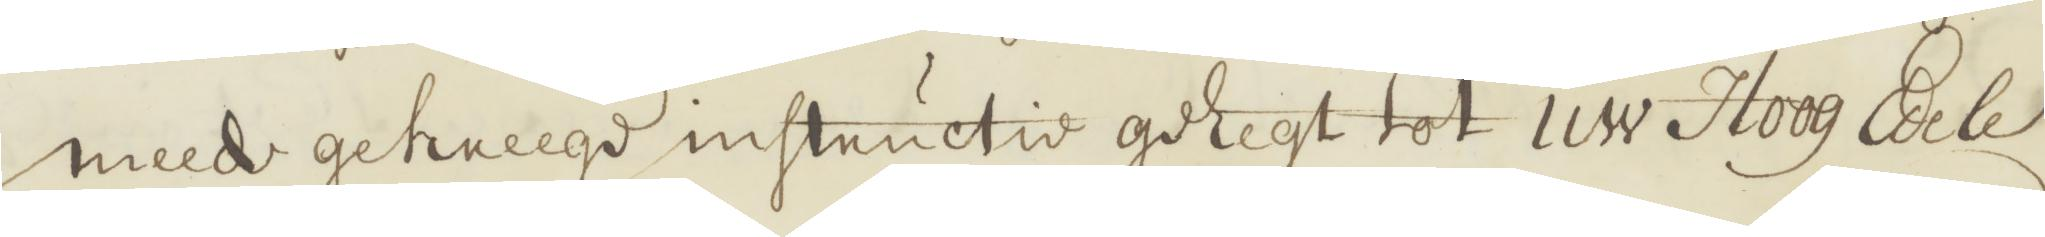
meede gekreege instructie gehegt tot uw Hoog Edele
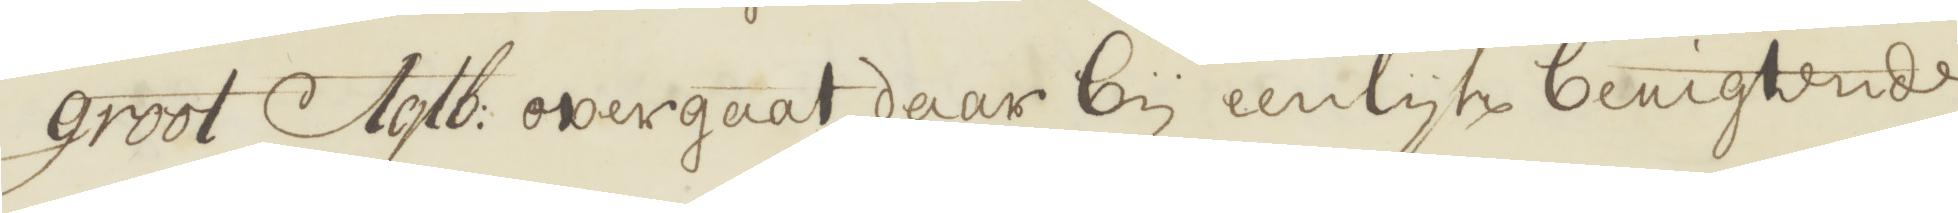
groot Agtb: overgaat, daar bij eenlijk berigtende
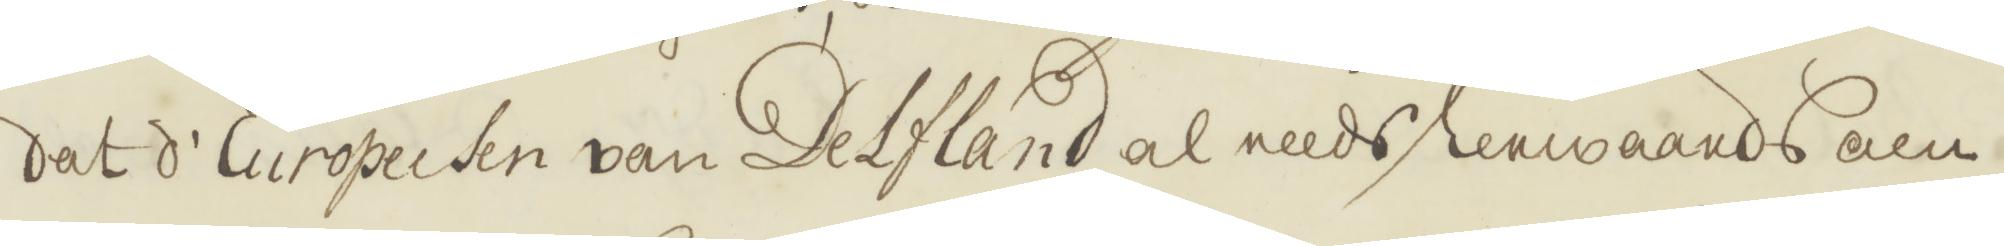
dat d’ Europeesen van Delfland al reeds herwaards aen
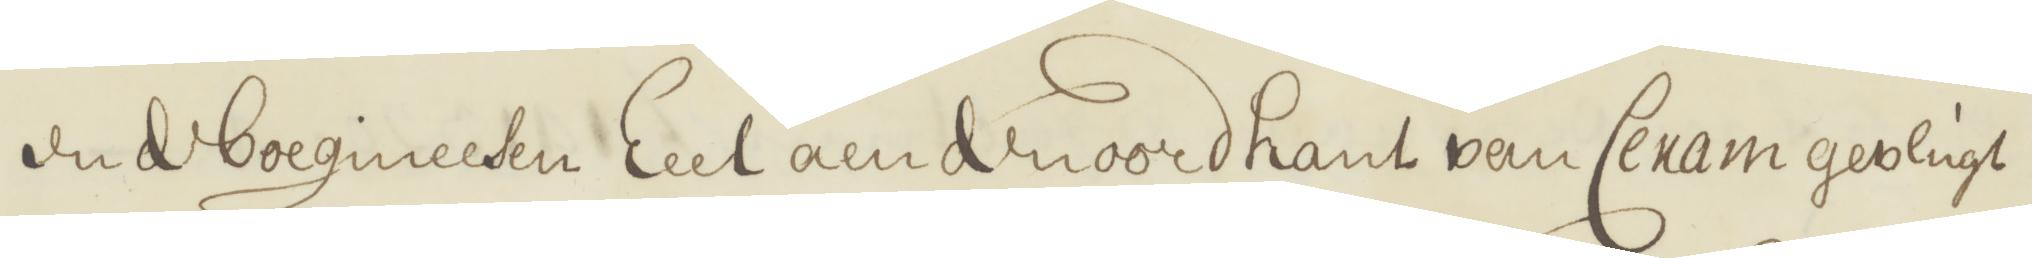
en de boegineesen heel aen denoordkant van Ceram gevlugt
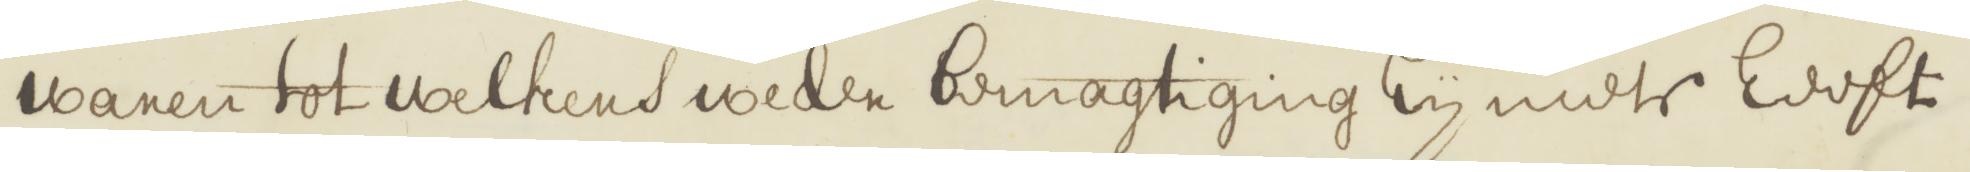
waren tot welkens weder bemagtiging hij niets heeft
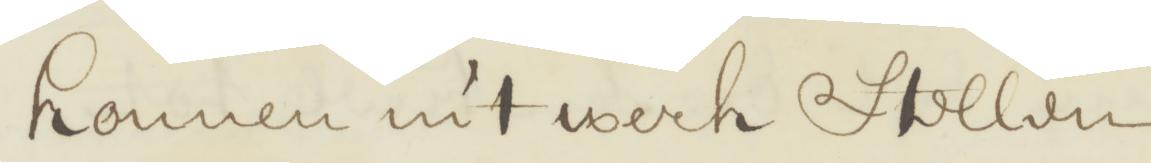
konnen in't werk stellen
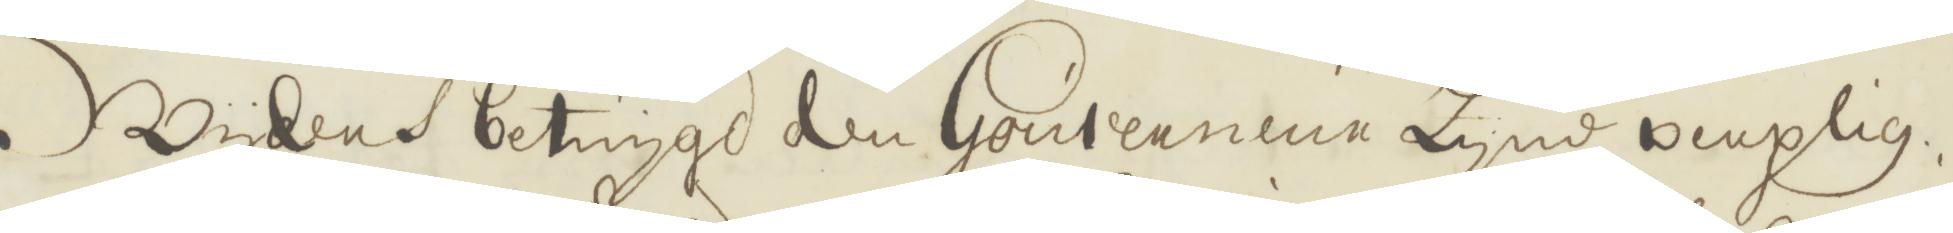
Wijders betuijgd den Gouverneur zijne verplig.
